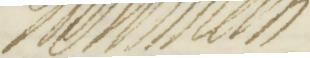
WRotman
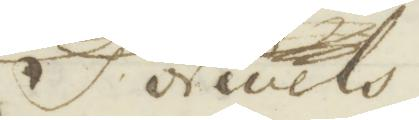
J: Nevels
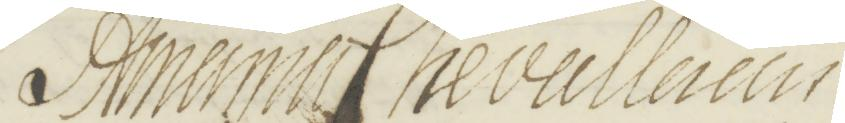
J AmamaChevallerau
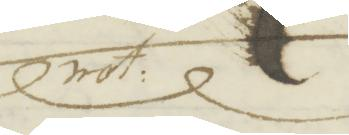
not:
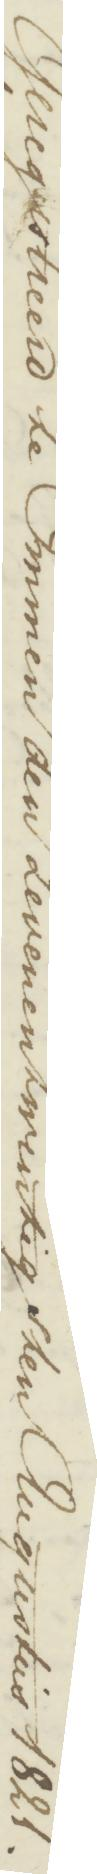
Geregistreerd te Ommen den Zevenentwintigsten Augustus 1821.
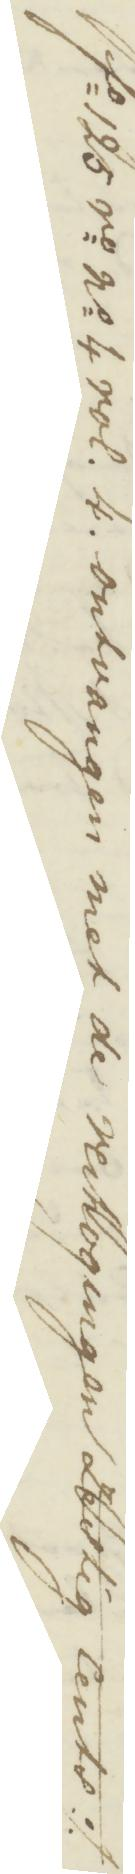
f=o 125 v=o n:o 4 vol. 4. ontvangen met de verhogingen Zestig cents :/.
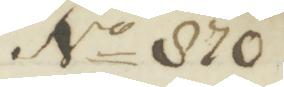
N=o 870
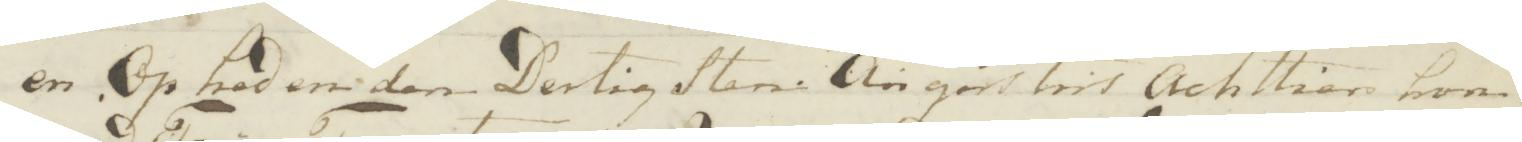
en Op heden den Dertigsten Augustus Achttien hon
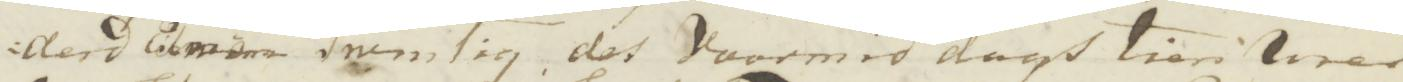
=derd Twee en Twintig des Voormiddags tien uren
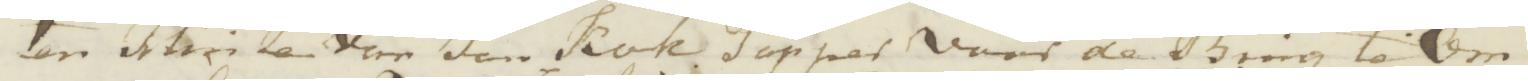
ten Huize van Ian Kok Tapper voor de Brug te Om
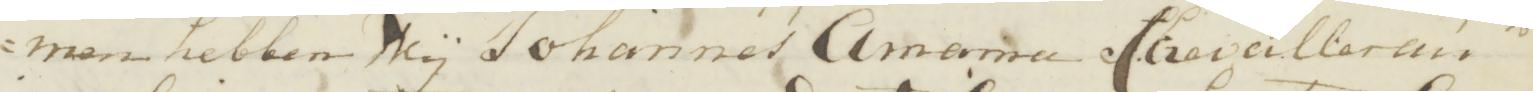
=men hebben Wij Iohannes Amana Chevallerau
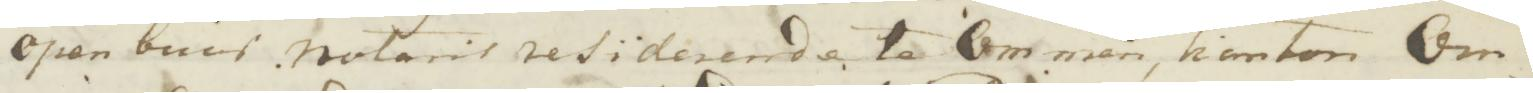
openbaar Notaris residerende te Ommen, kanton Om
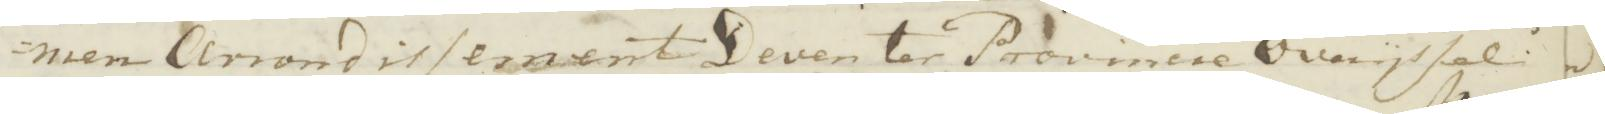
=men Arrondissement Deventer Provincie Overijssel:
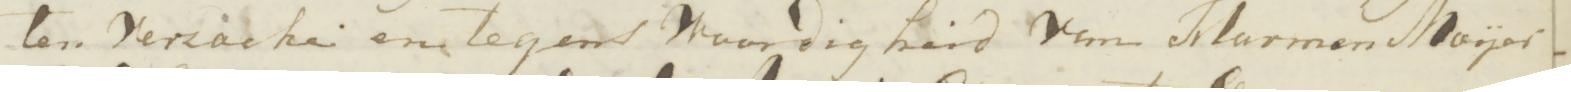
ten Verzoeke en tegenswoordigheid van Harmen Maijer
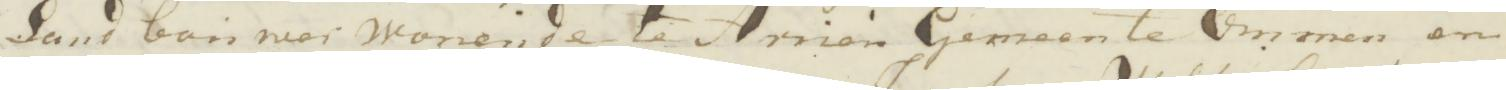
Land bouwer wonende te Arrien Gemeente Ommen en
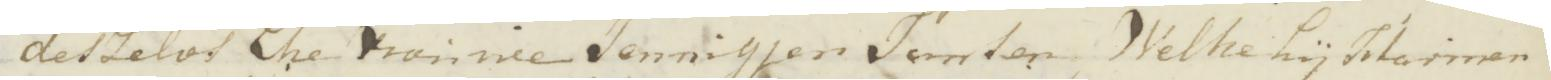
deszelvs Ehe Vrouwe Jennigjen Jansen Welke hij Harmen
